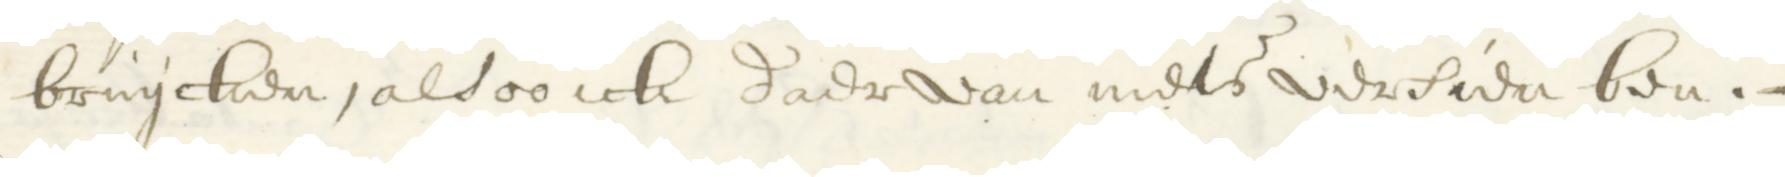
bruijcken, alsoo ick daer van niets versien ben.
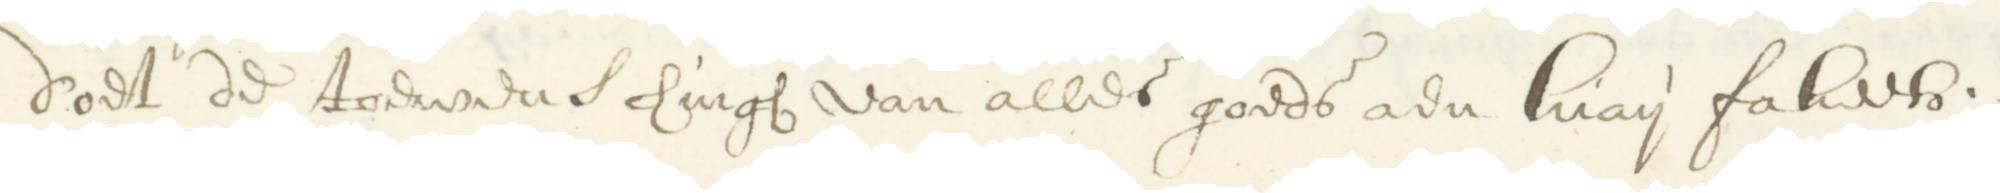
doet de toewensching van alles goeds aen kiaij fakeeh.
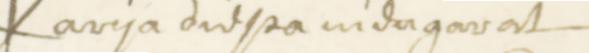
* arija diepa niengarat
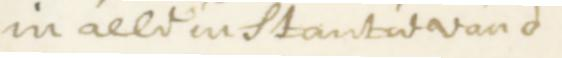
in alle instantie van d
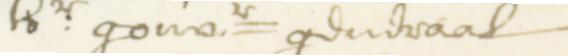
h:r gouv.=r generaal
